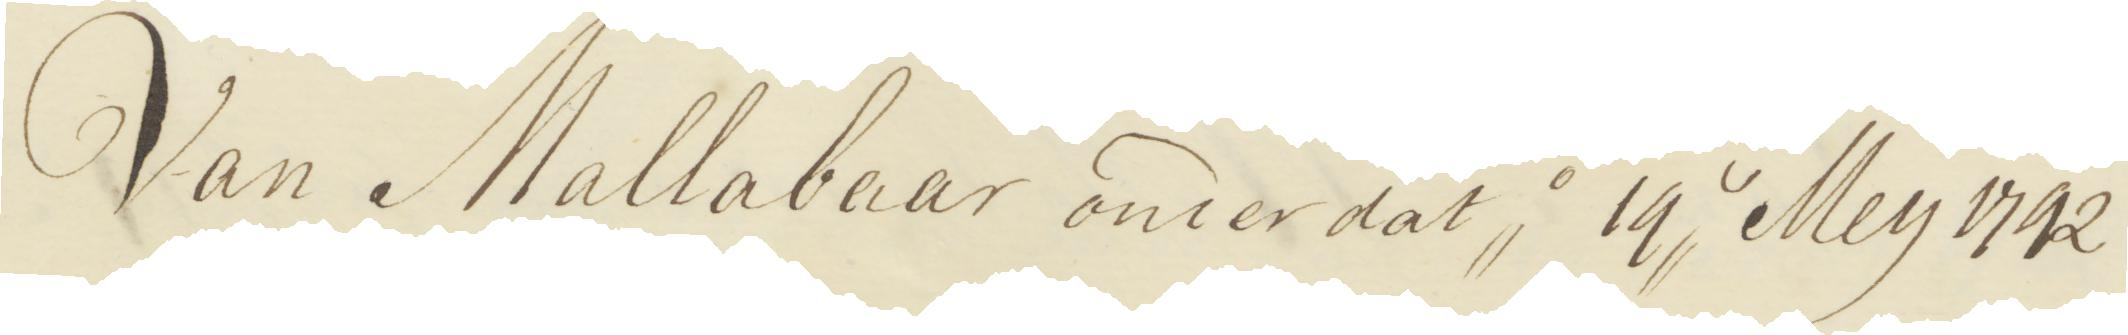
Van Mallabaar onder dat„o 14„' Mey 1742
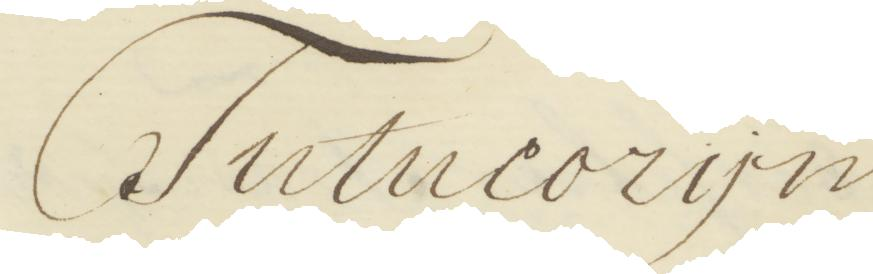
Tutucorijn
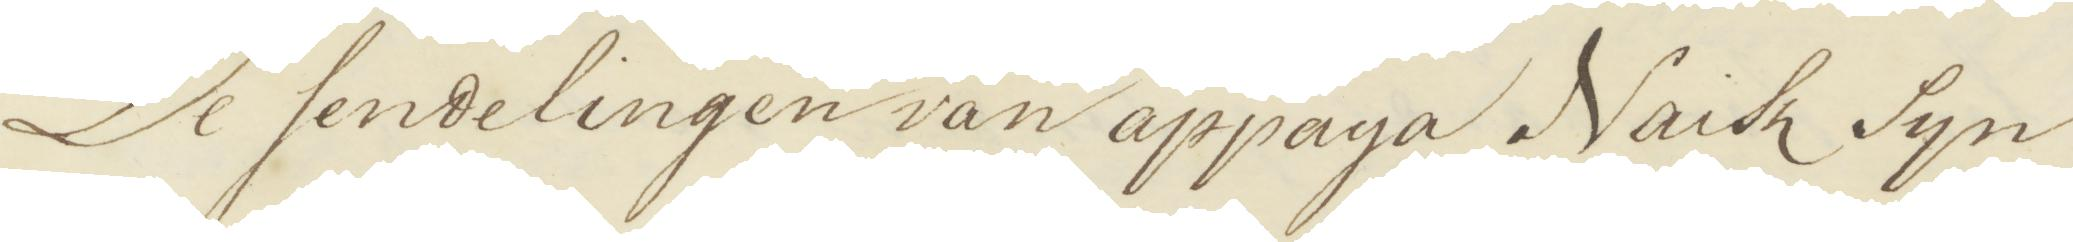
De sendelingen van appaya Naik syn
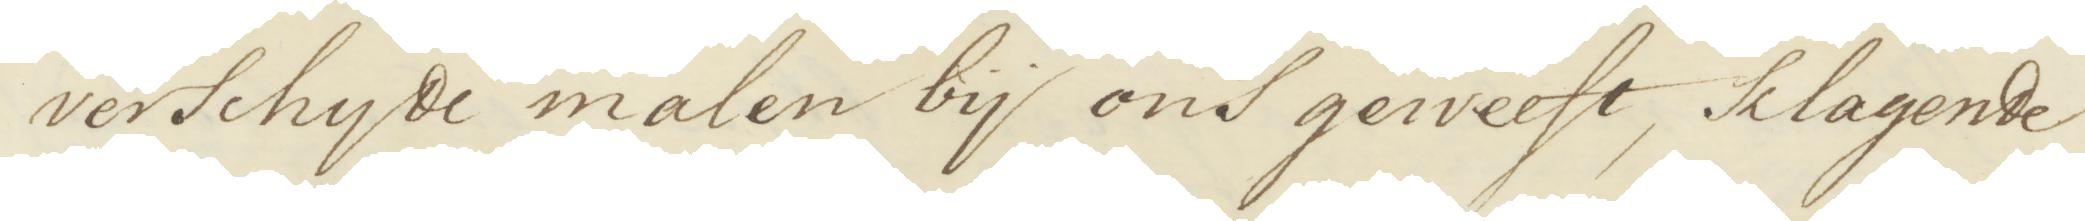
verschyde malen bij ons geweest, klagende
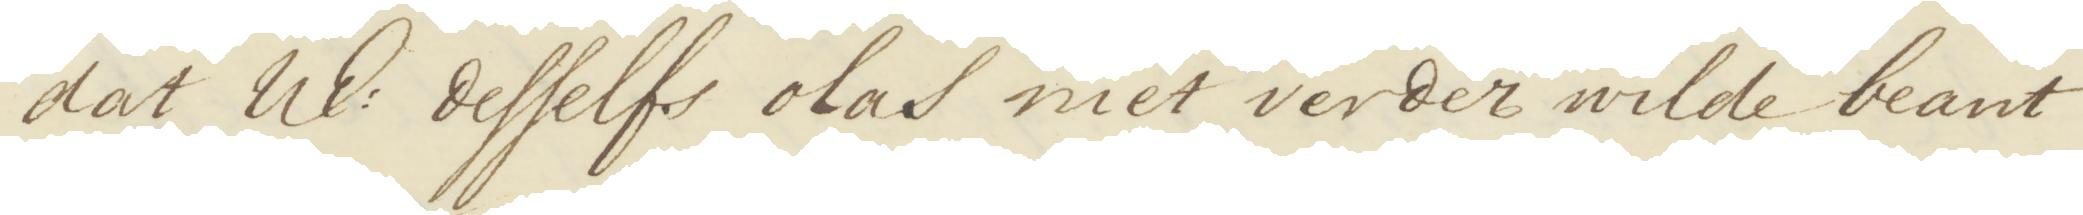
dat UE: desselfs olas niet verder wilde beant
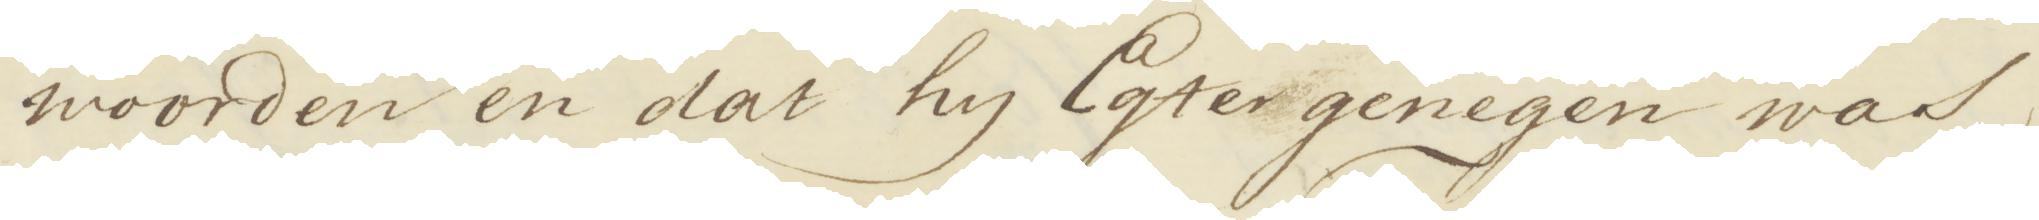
woorden en dat hy Egter genegen was
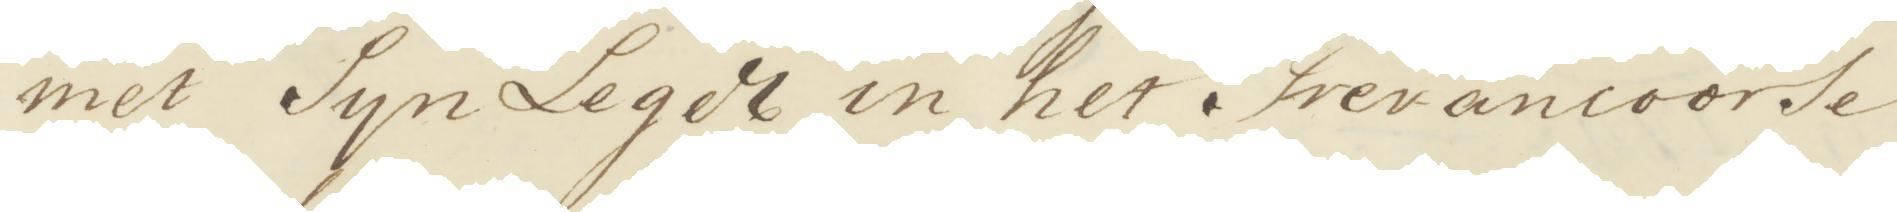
met syn Leger in het Trevancoorse
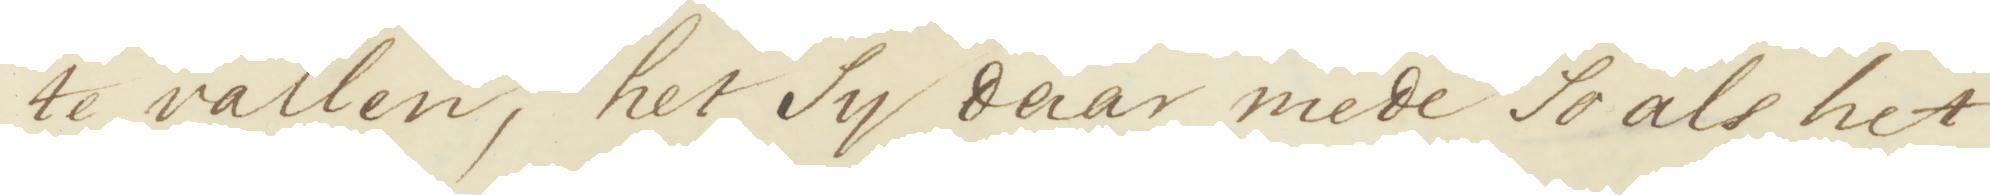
te vallen, het sy daar mede so als het
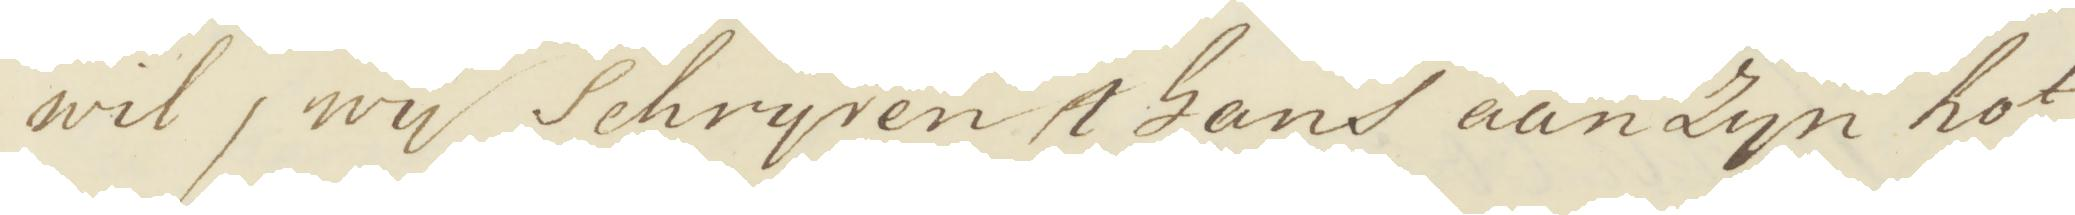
wil, wy schryven thans aan zijn ho„t
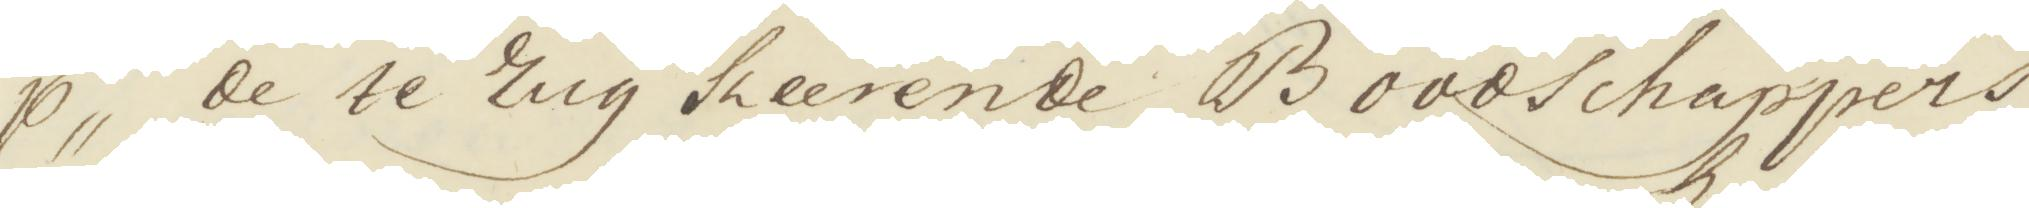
p„r de te rug keerende Boodschappers
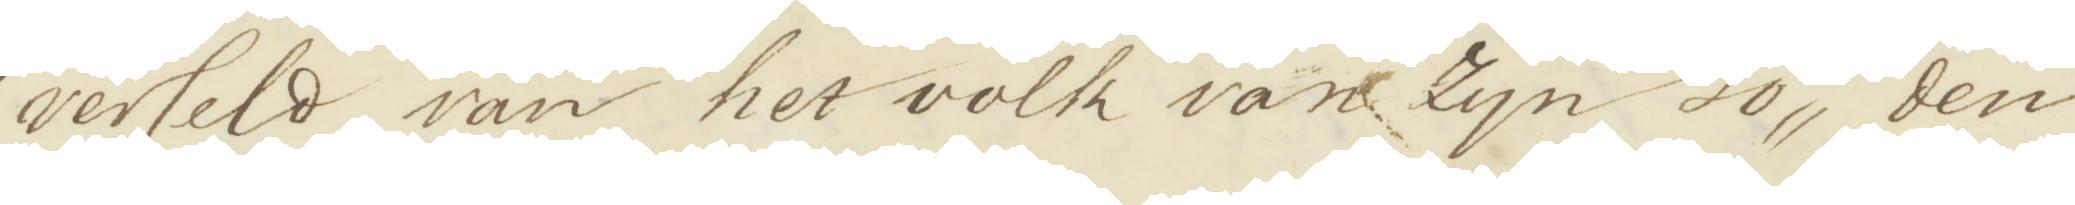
verseld van het volk van zyn ho„t den
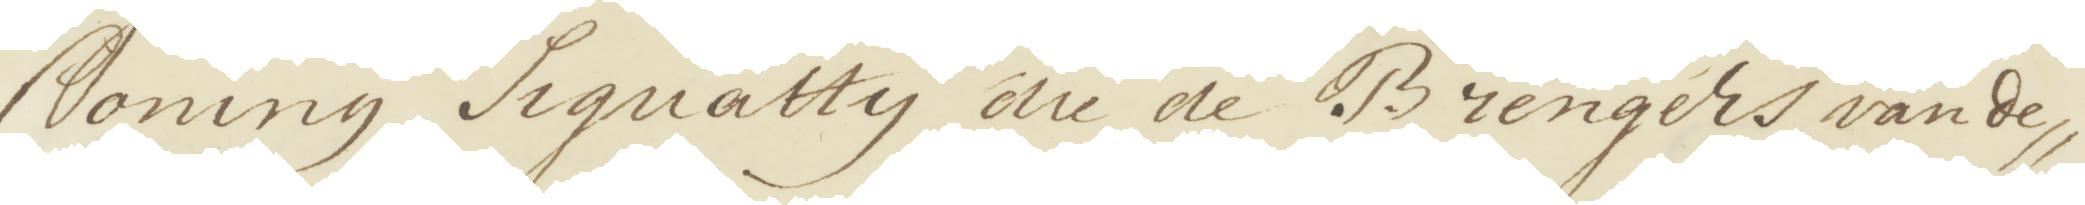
Coning signatty die de Brengers van de„
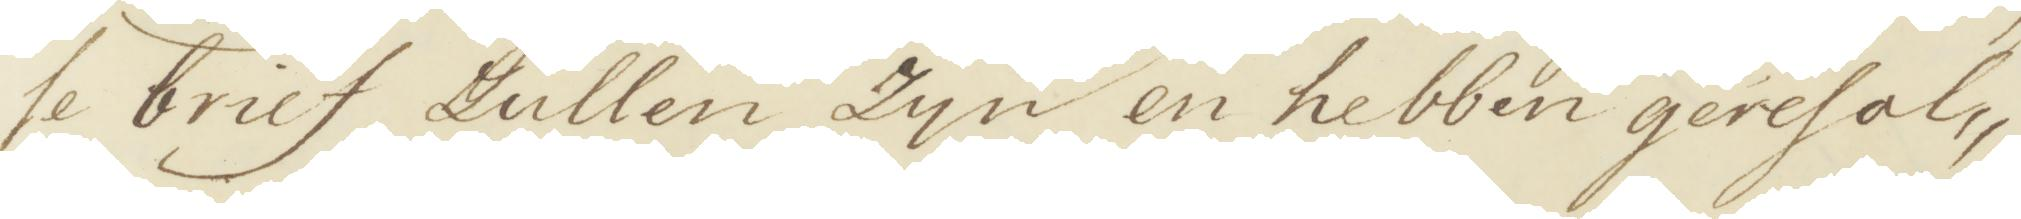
se brief zullen zyn en hebben geresol„
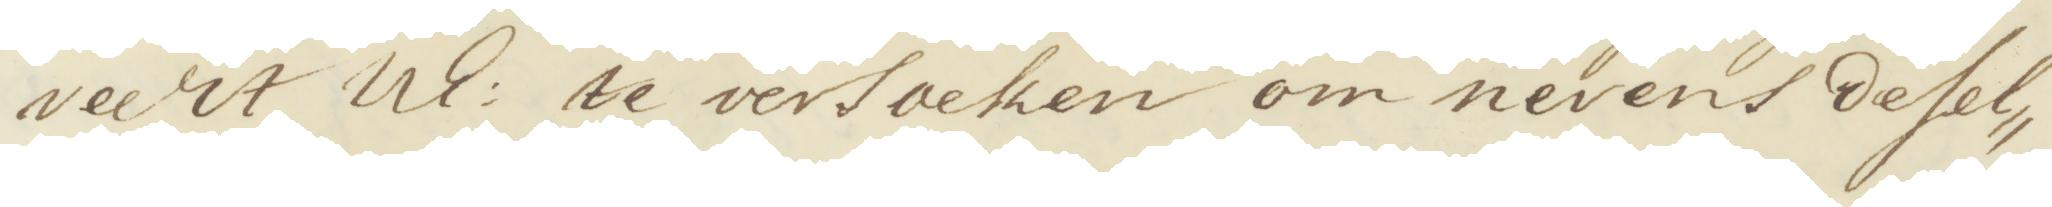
veert UE: te versoeken om nevens desel„
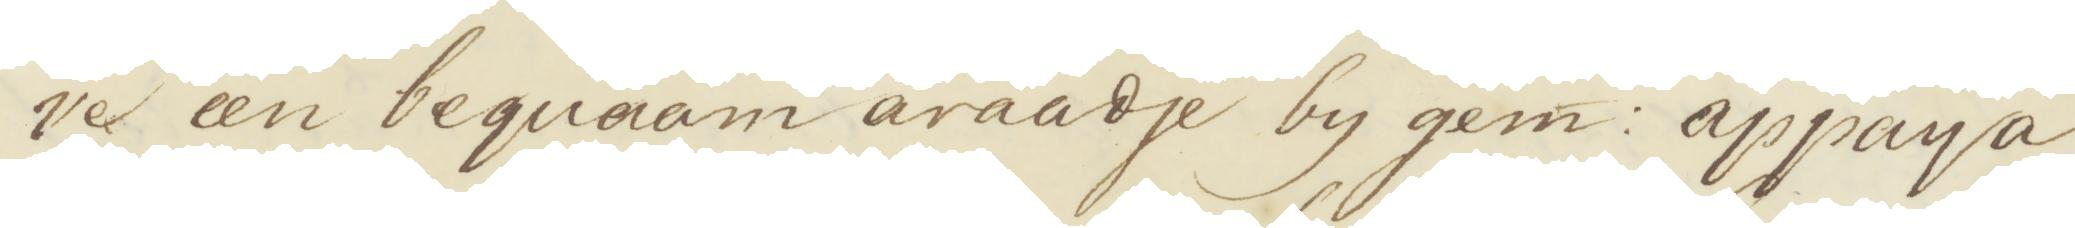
ve een bequaam araadje by gem: appaya
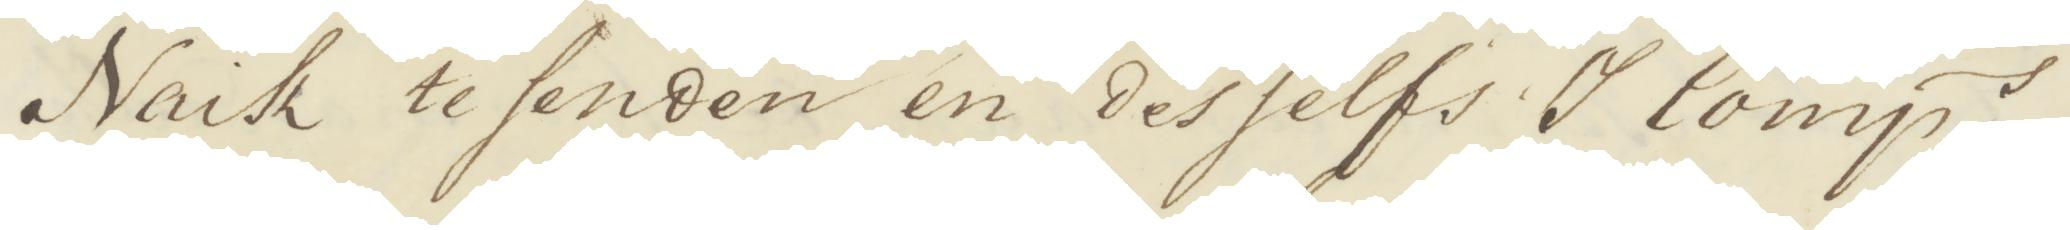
Naik te senden en desselfs ’s Comp„s
